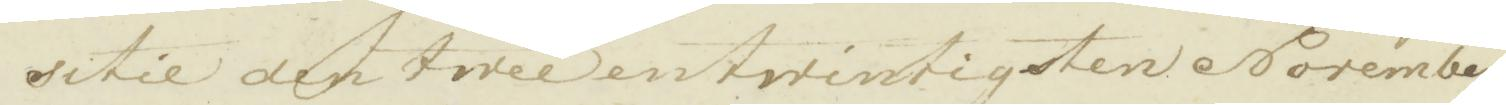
sitie den twee en twintigsten November
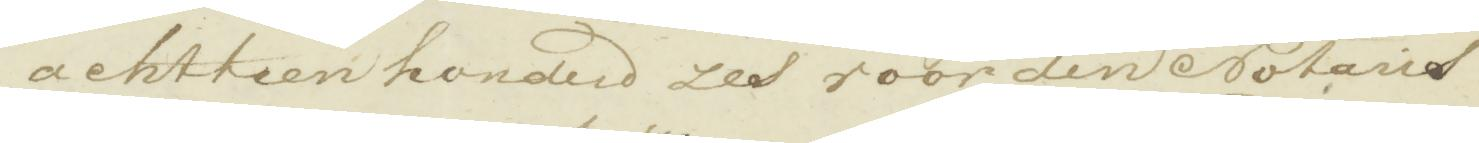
achttien honderd zes voor den Notaris
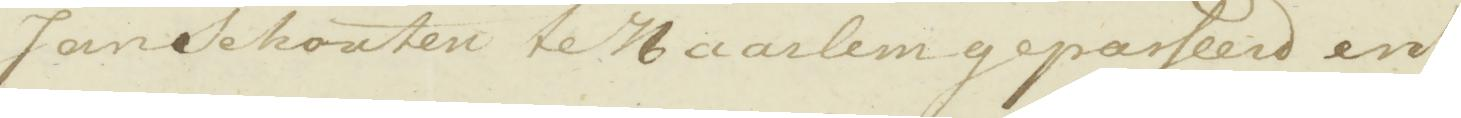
Jan Schouten te Haarlem gepasseerd en
